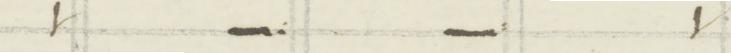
1 —: —: 1
